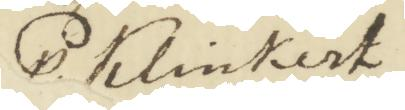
G: Klinkert
